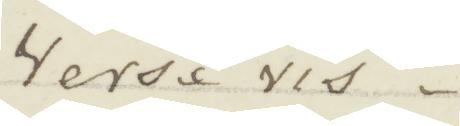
Verse vis -
